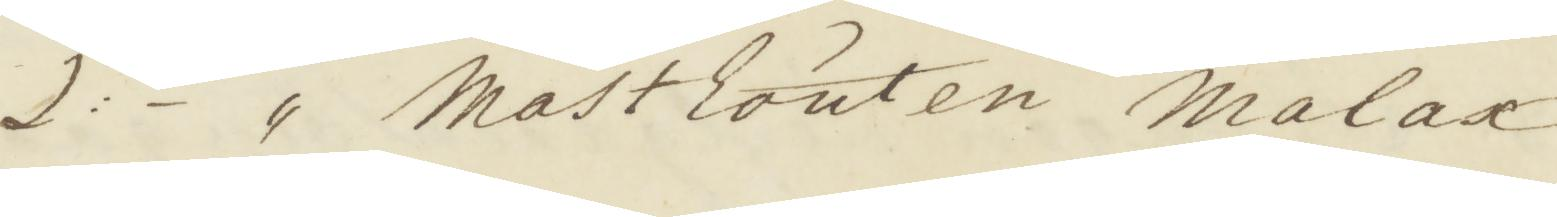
2:- „ masthouten malax
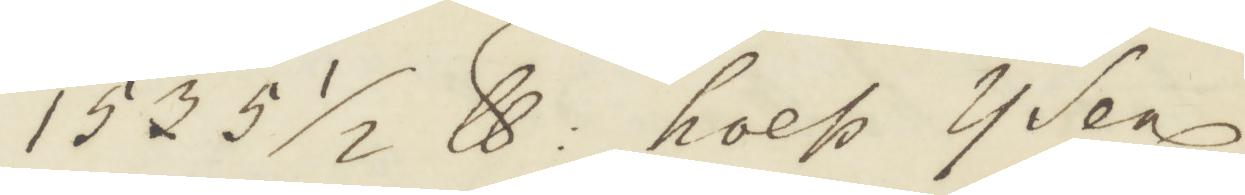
1535½ lb: hoep ijser
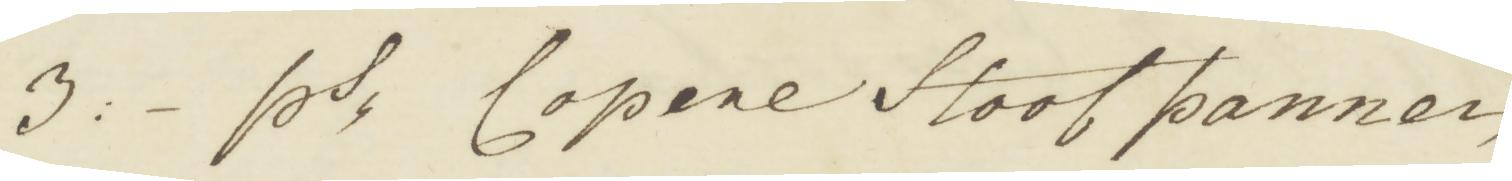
3: – p„s Copere stoof pannen,
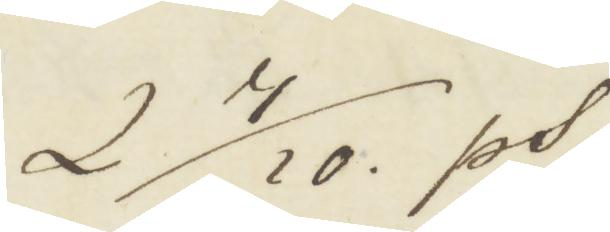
2 7/20. ps.
